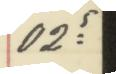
02=5
